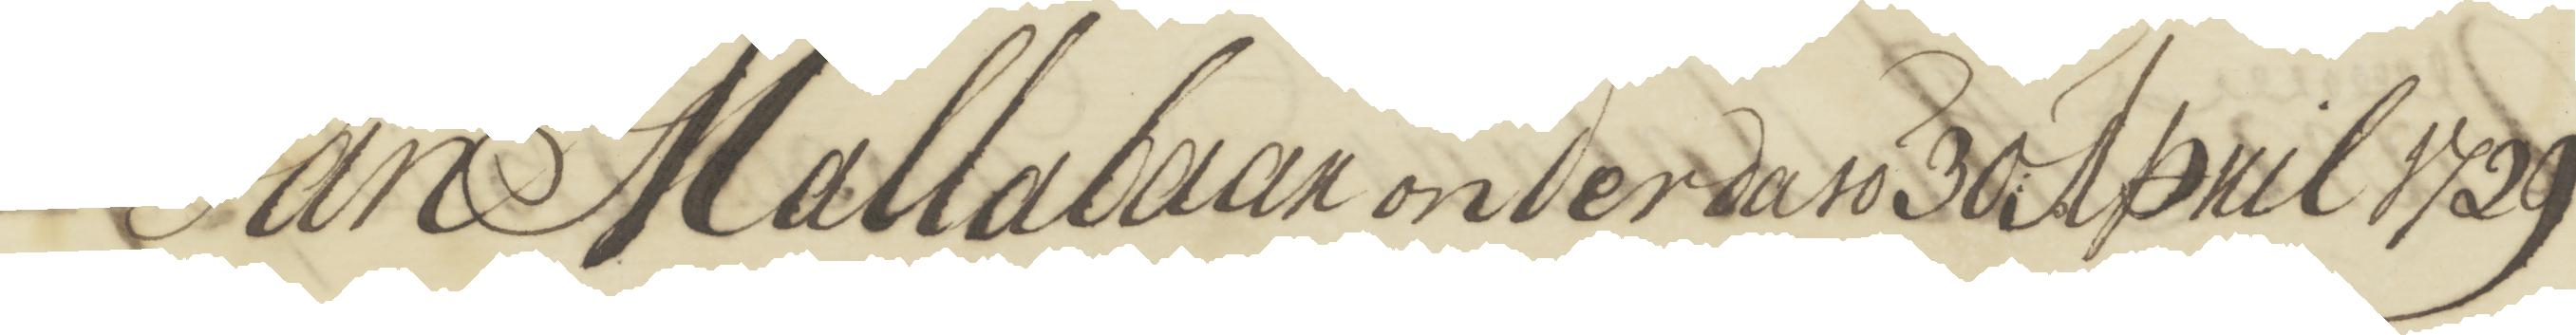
Van Mallabaar onder dato 30:' April 1729
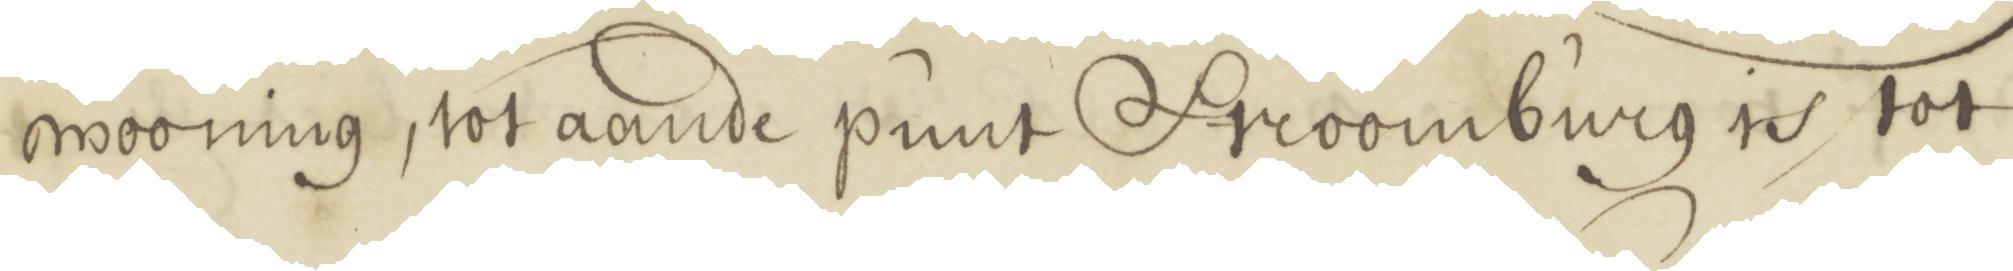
wooning, tot aande punt Stroomburg is tot
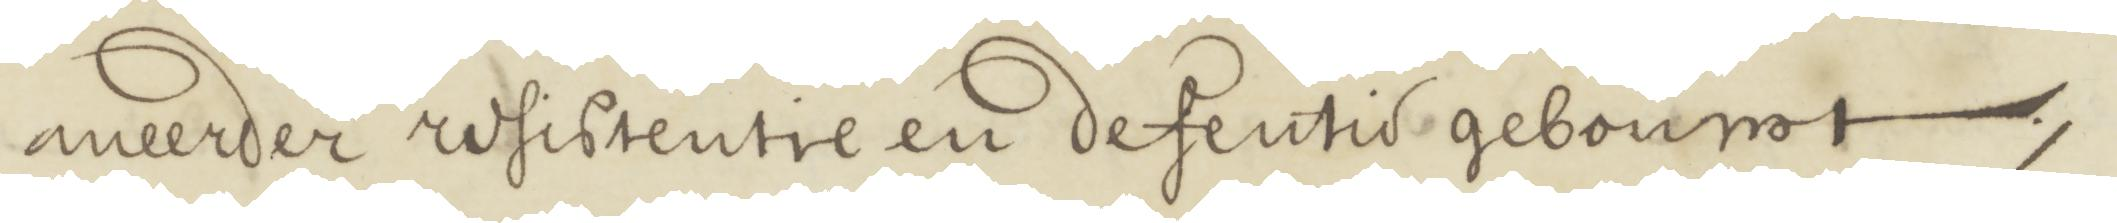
meerder resistentie en defentie gebouwt,
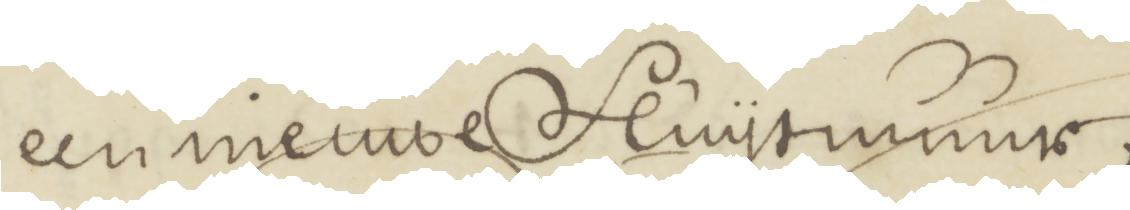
een nieuwe Sluijtmuur
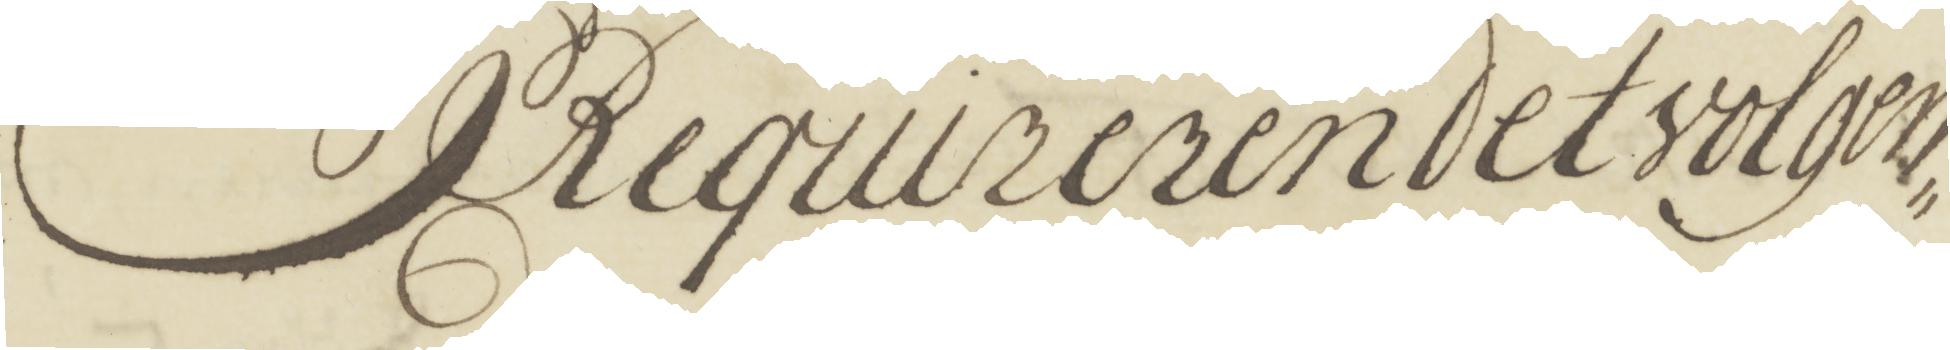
Requireren de't volgen„
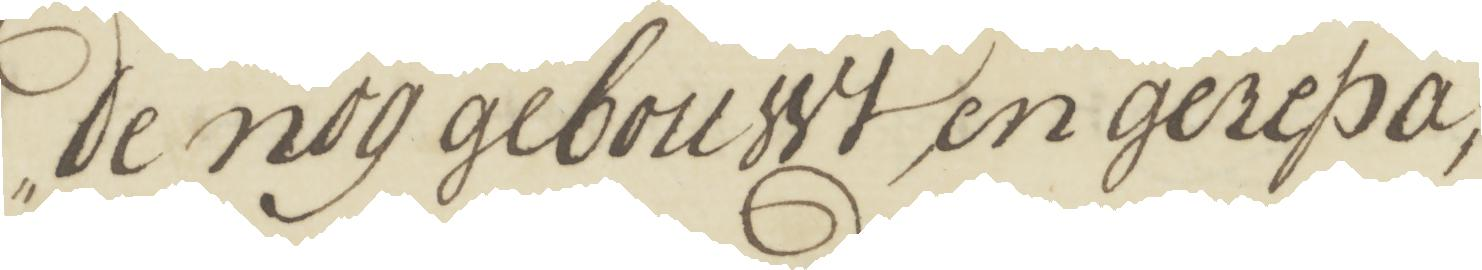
„de nog gebouwt en gerepa
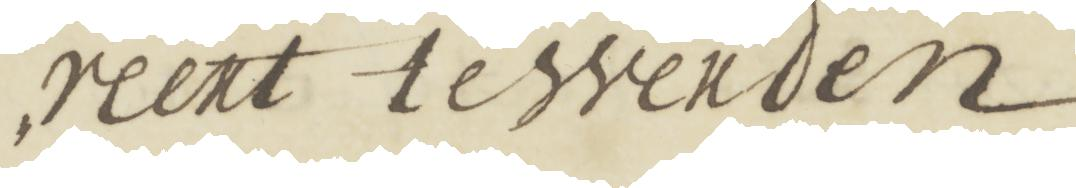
„reert te werden
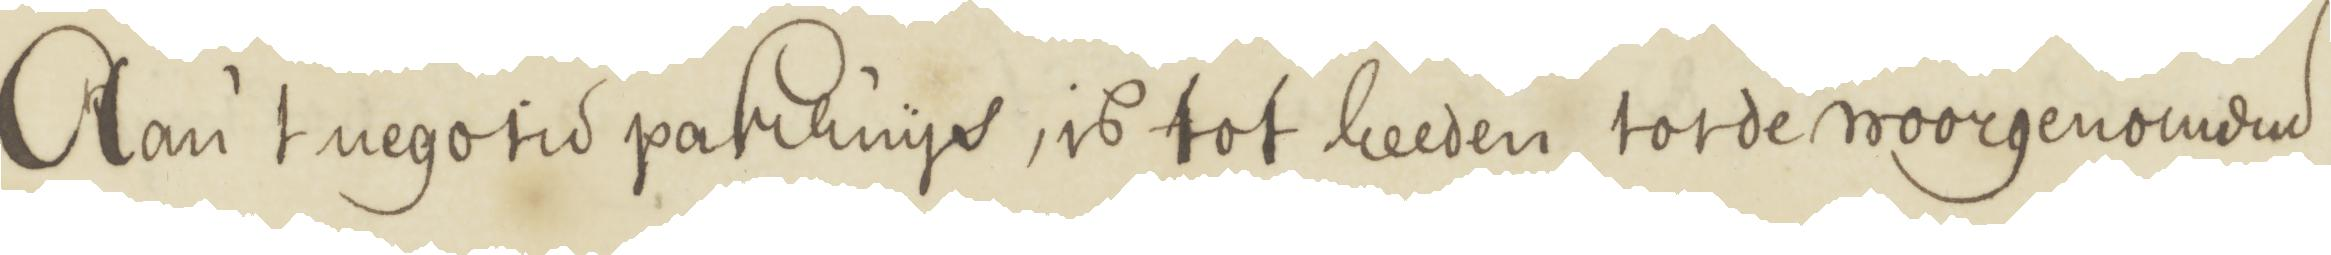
Aan’t negotie pakhuijs, is tot heeden, tot de voorgenomene
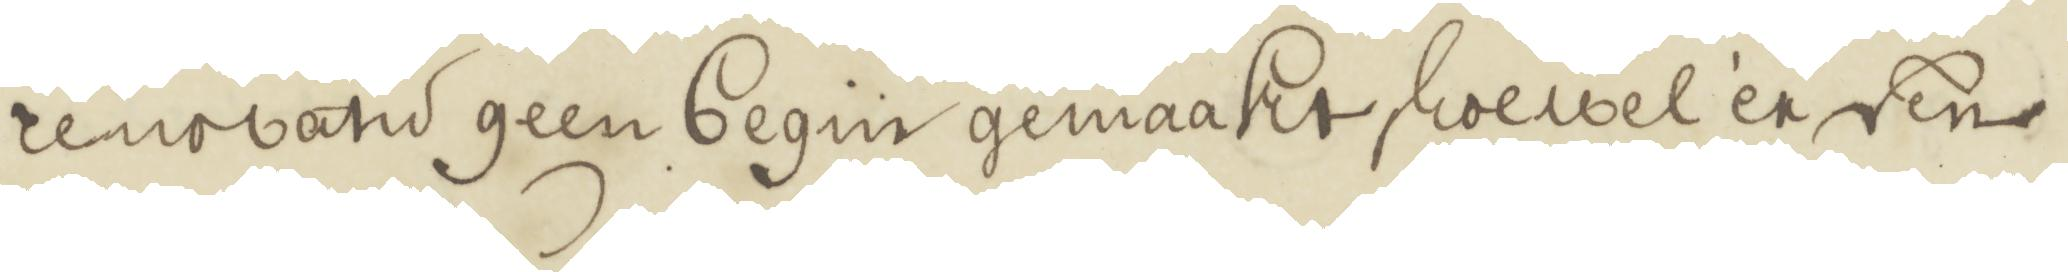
renovatie geen begin gemaakt, hoewel 'er Een
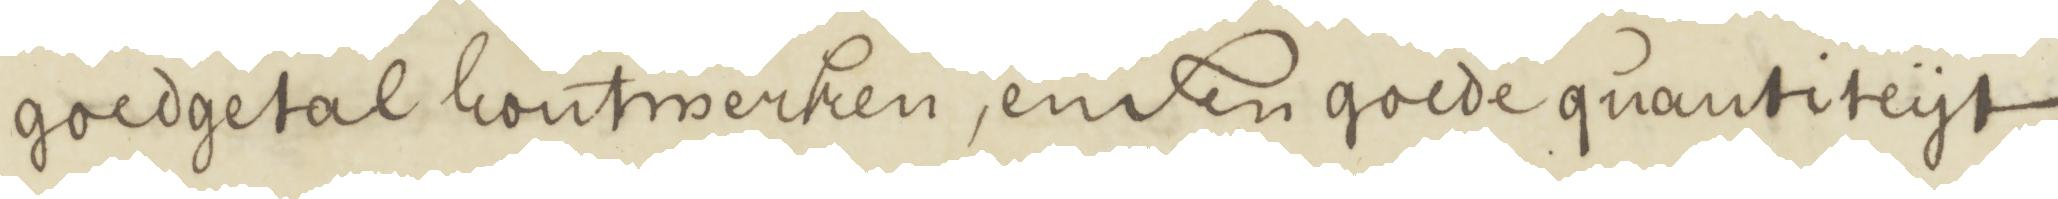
goedgetal houtwerken, en Een goede quantiteijt
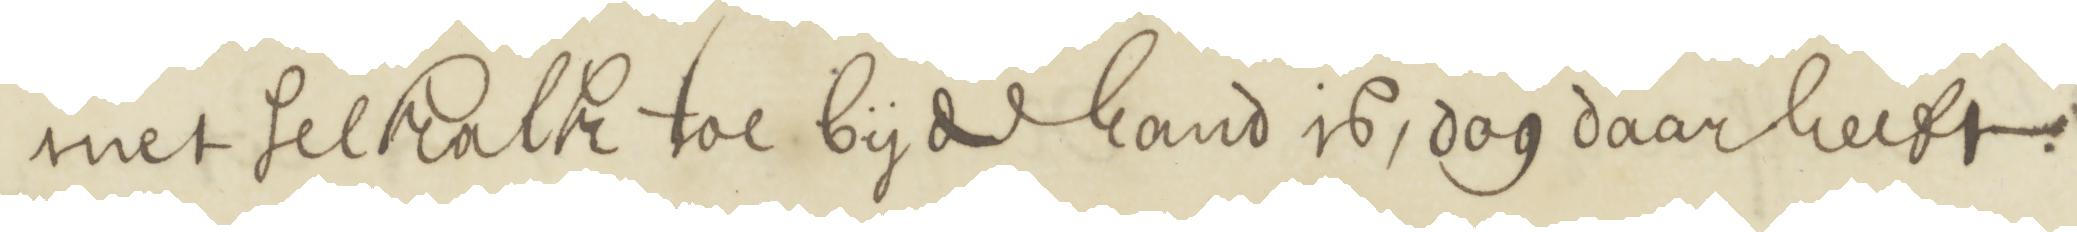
met sel kalk toe bij de hand is, dog daar heeft
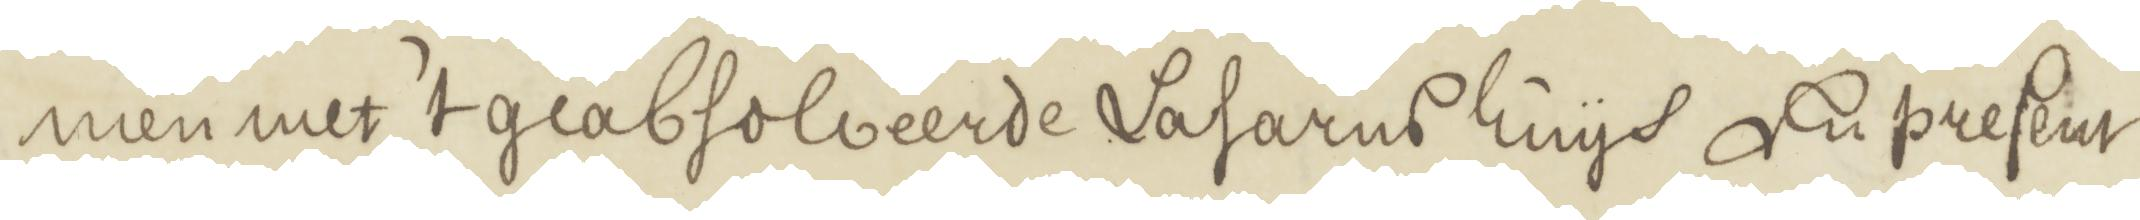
men met ’t geabsolveerde Lasarus huijs En present
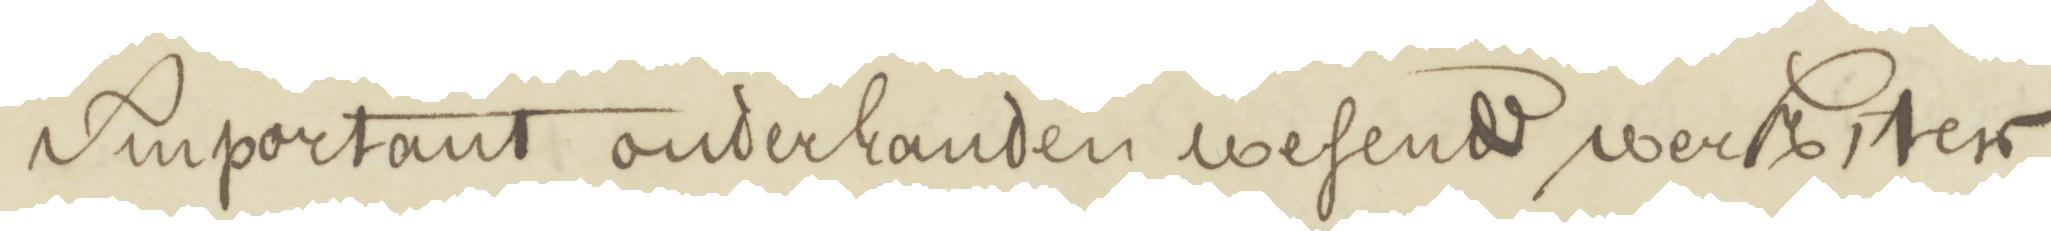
Important onderhanden wesende werk, ter
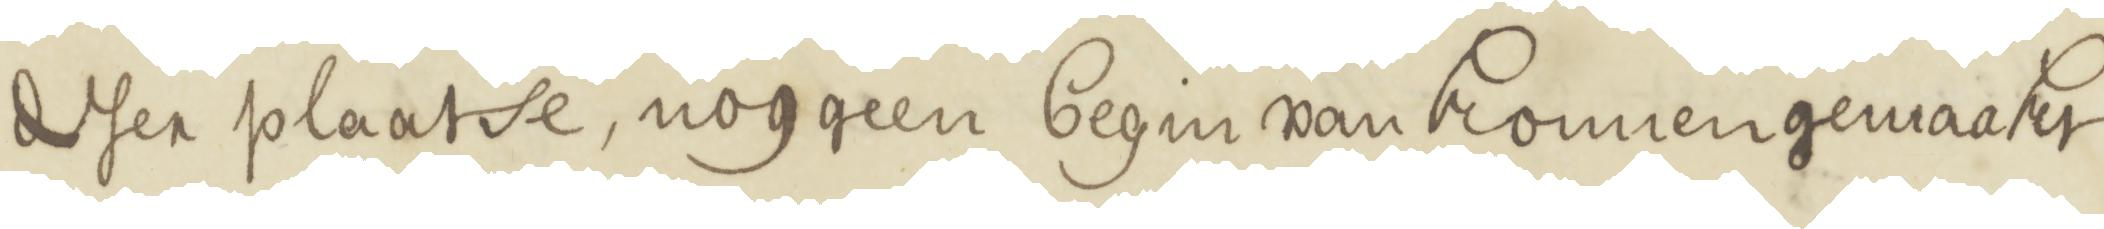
deser plaatse, nog geen begin van konnen gemaakt
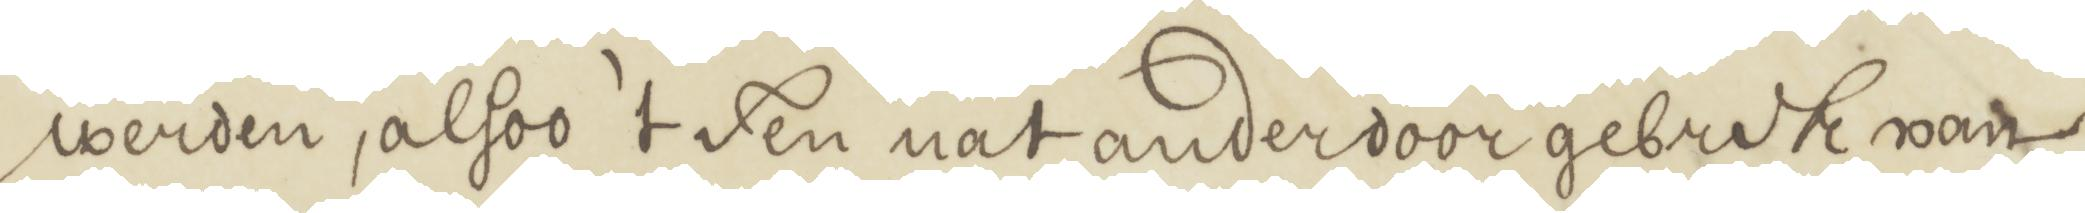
werden, alsoo ’t Een na 't ander door gebrek van
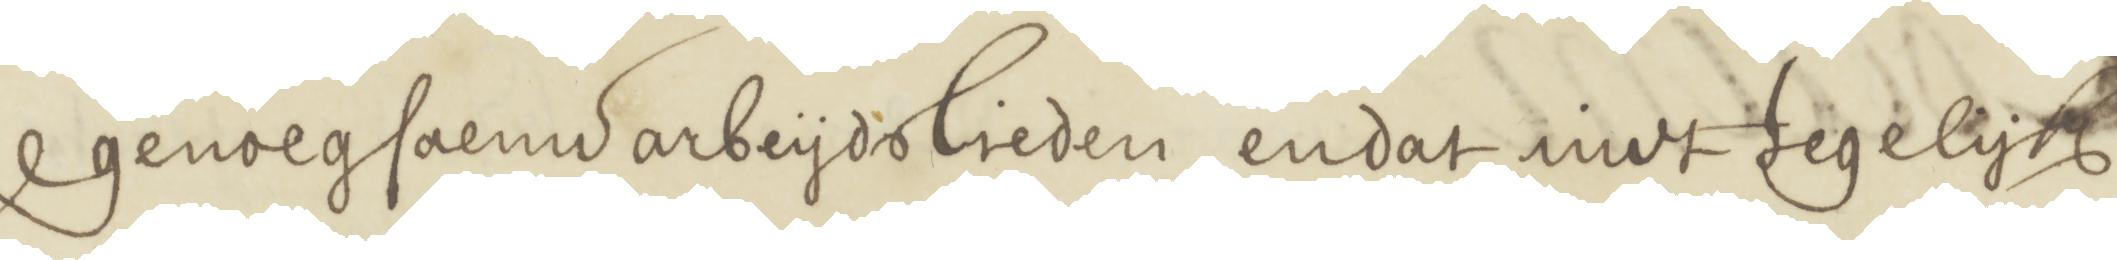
genoegsaeme arbeijdslieden, en dat niet tegelijk
